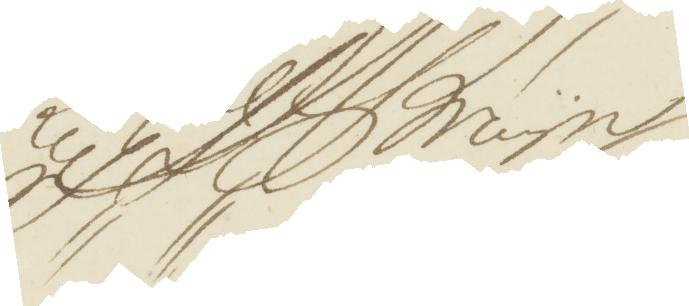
AHMijn
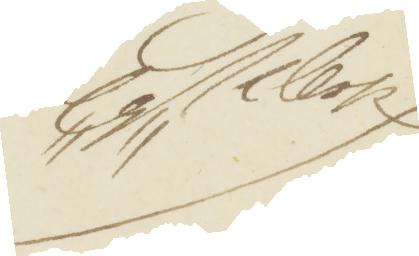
G„g„ Clerk
